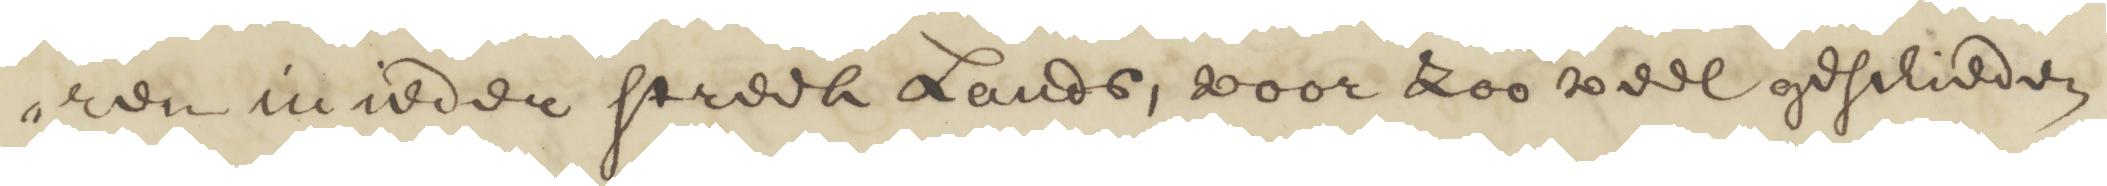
„ren in ieder streek Lands, voor zoo veel geschieden
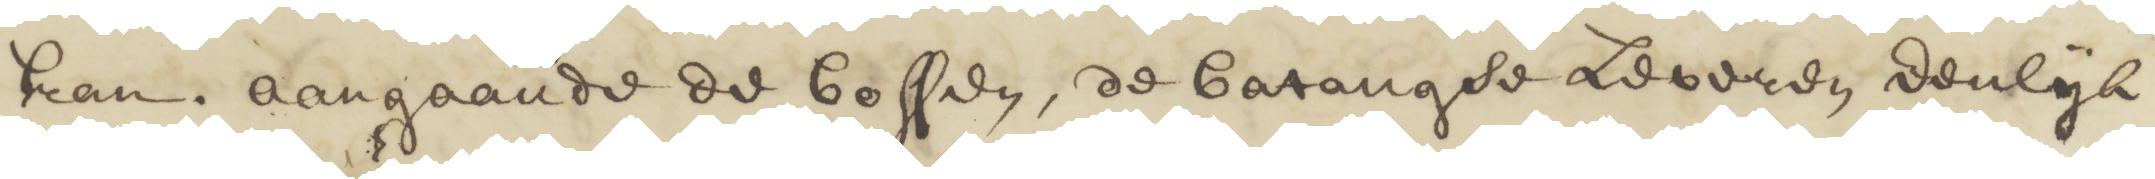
kan. aangaande de bossen, de batangse Leveren Eenlijk
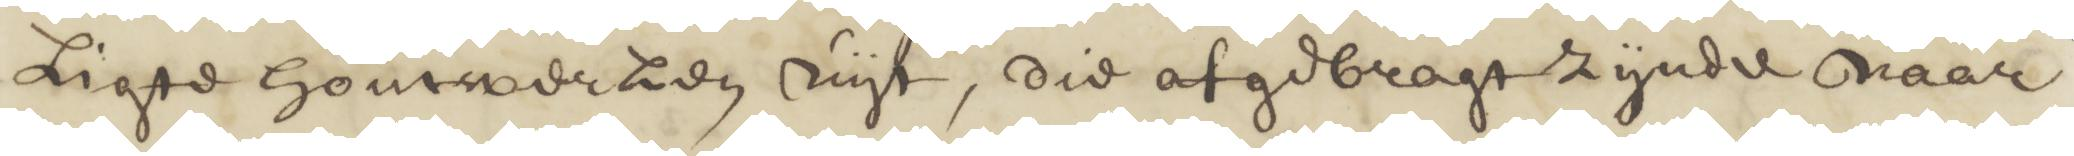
Ligte houtwerken uijt, die afgebragt zijnde naar
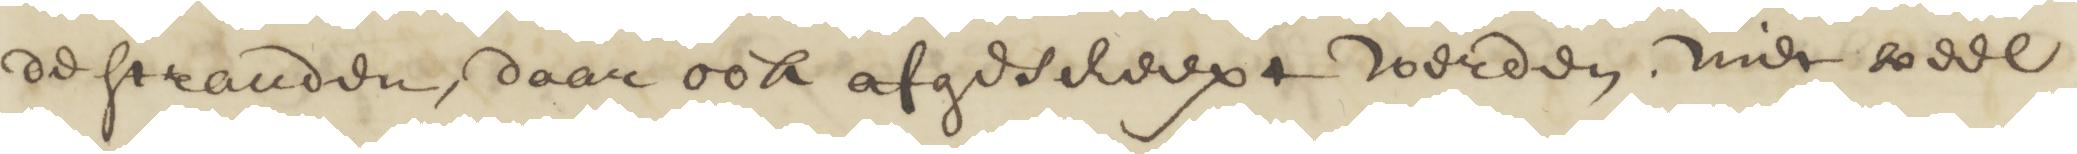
de stranden, daar ook afgescheept werden, niet veel
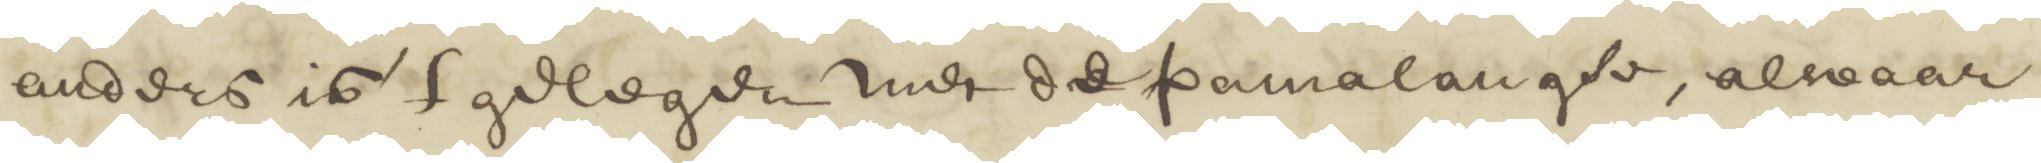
anders is 't gelegen met de pamalangse, alwaar
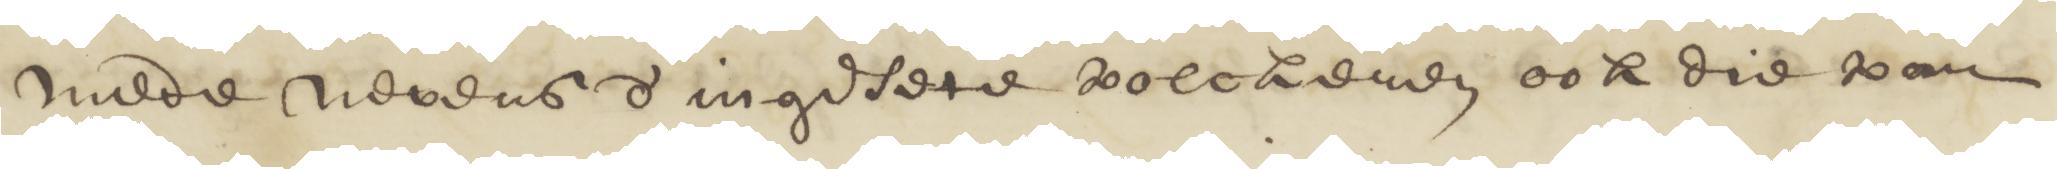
mede nevens d ingesete volckeren ook die van
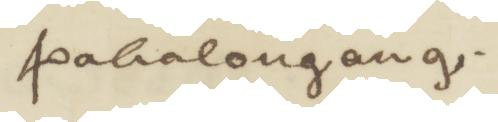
palialongang -
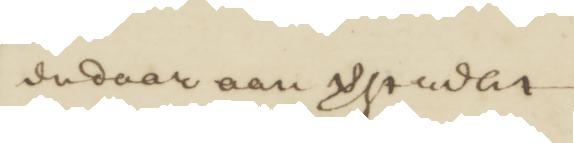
en daar aan verstrekt
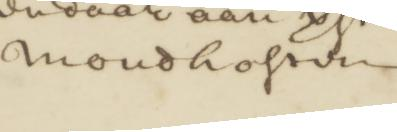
mondkosten
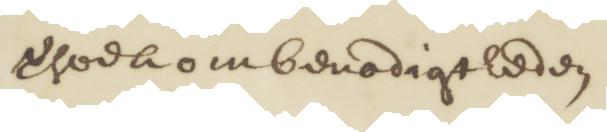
versoek om benodigtheden
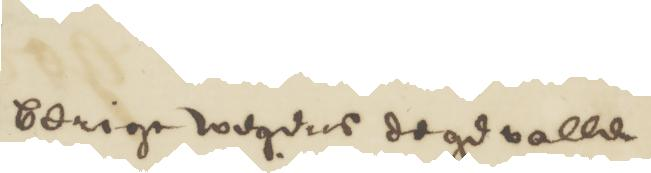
berigt wegens de gevalle
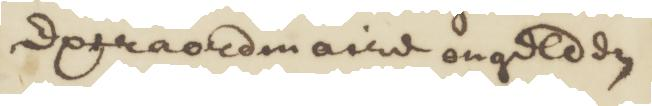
Extraordinaire ongelden
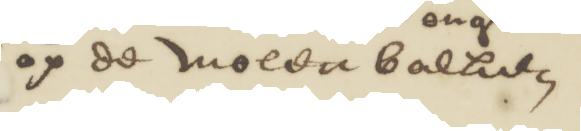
op de molen balken
